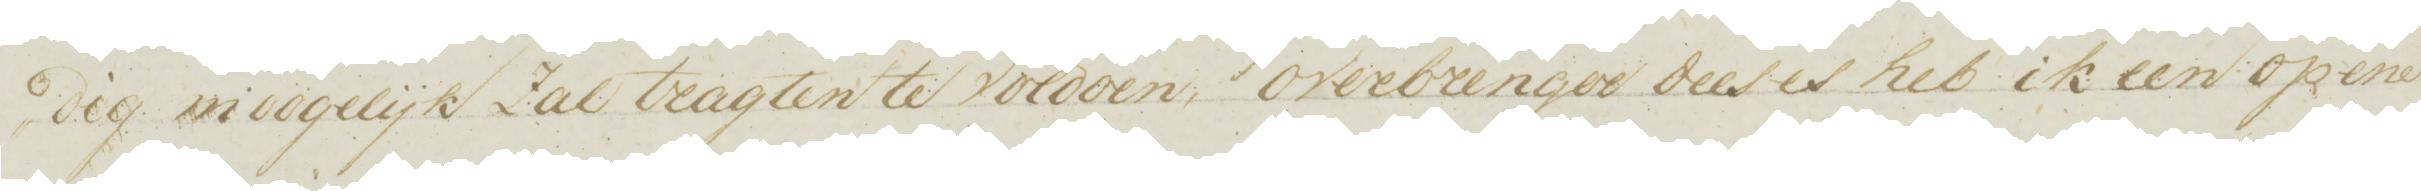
„dig moogelijk Zal tragten te voldoen, overbrenger deeses heb ik een opene
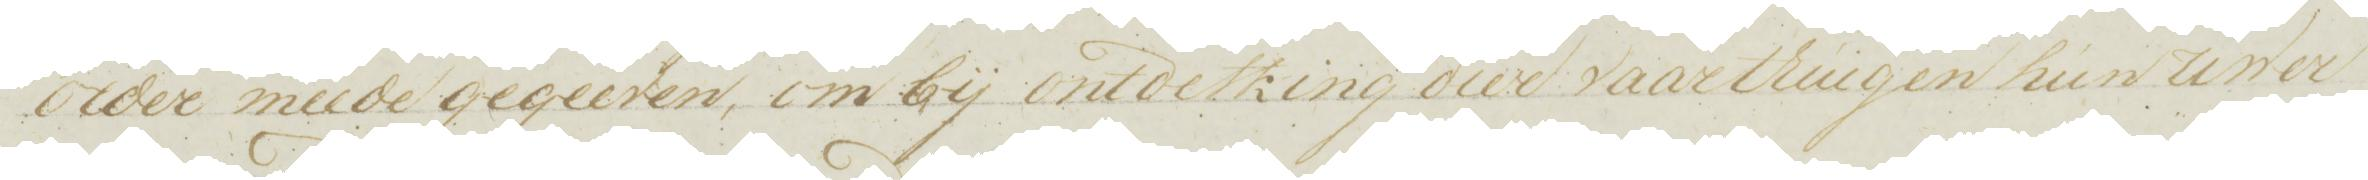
order meede gegeeven, om bij ontdekking dier vaarthuigen hun Uwer
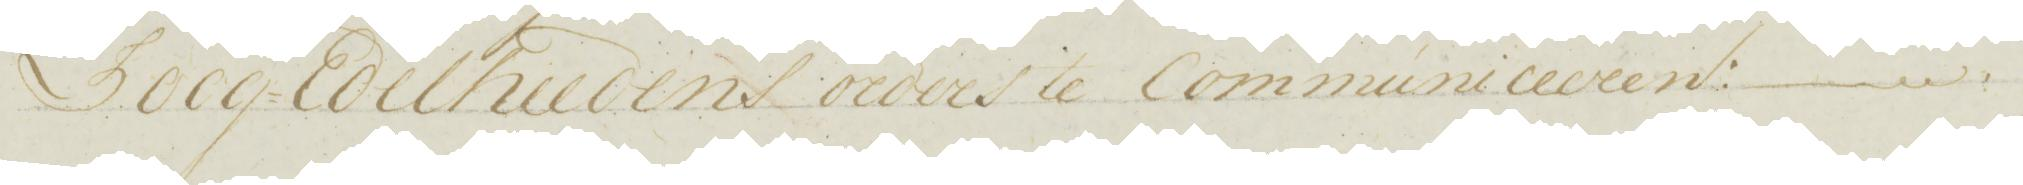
Hoog=Edelheedens orders te Communiceeren: —
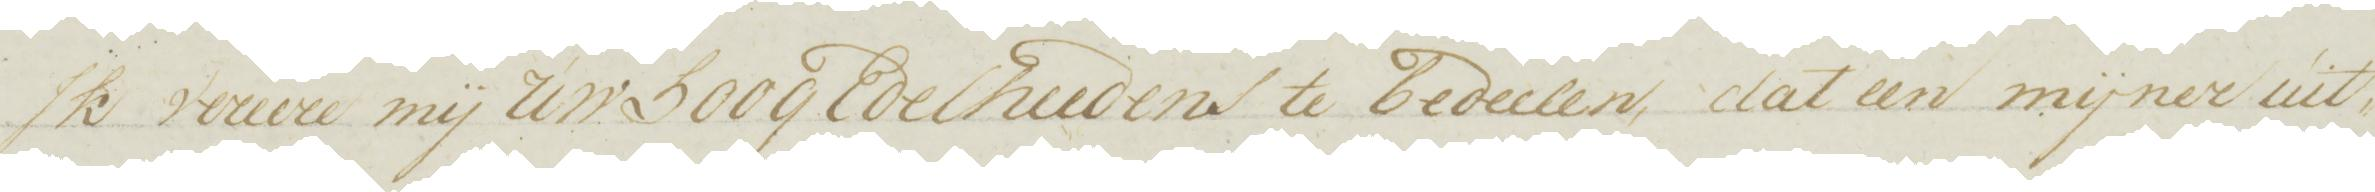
Jk vereere mij UW Hoog Edelheedens te bedeelen, dat een mijner uit„
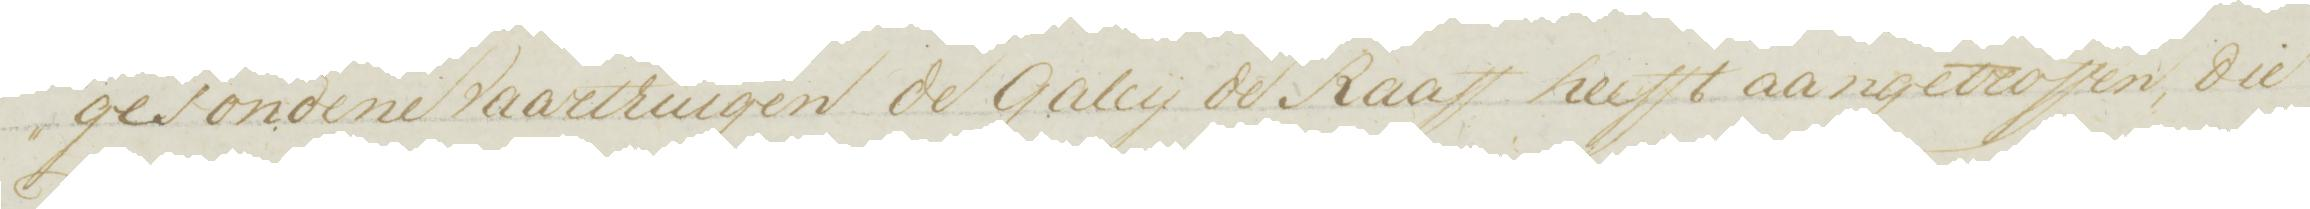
„gesondene Vaarthuigen de Galeij de Raaff heefft aangetroffen, die
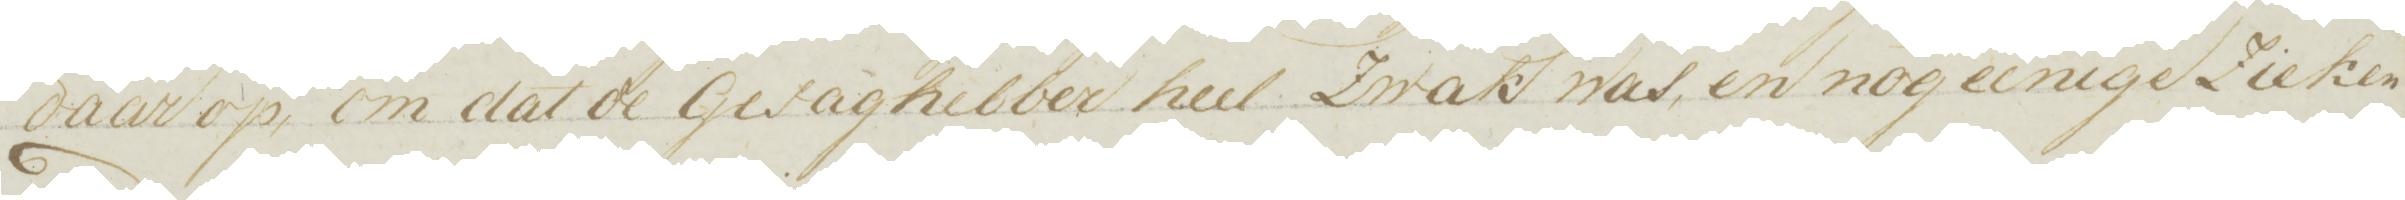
daar op, om dat de Gesaghebber heel Zwak was, en nog eenige Zieken
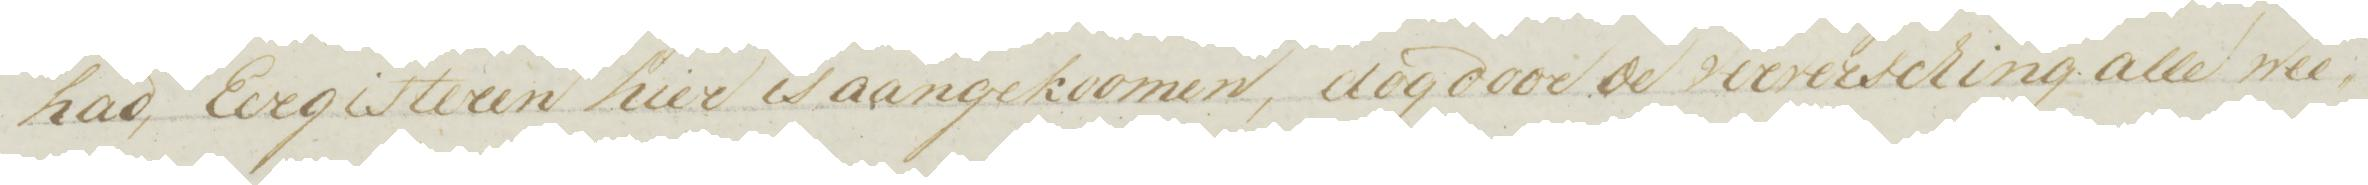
had, Eergisteren hier is aangekoomen, dog door de verversching alle wee„
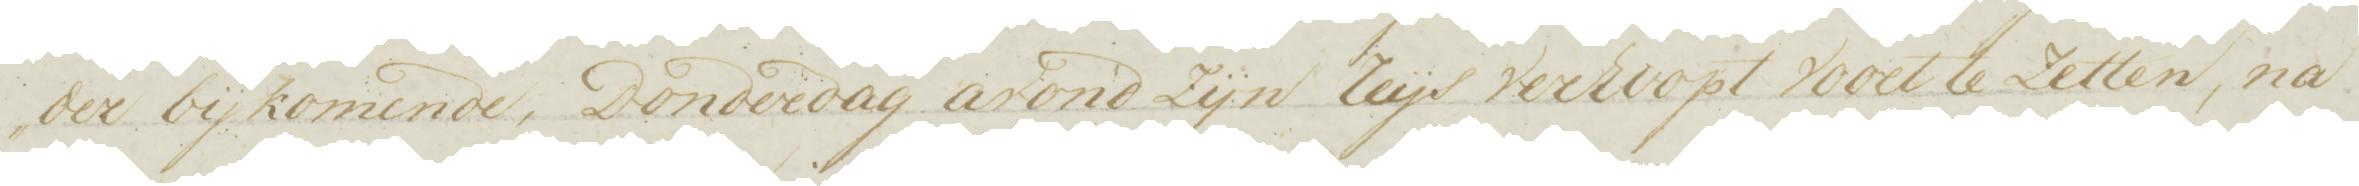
„der bij komende, Donderdag avond zijn Reijs Verhoopt Voort te Zetten, na
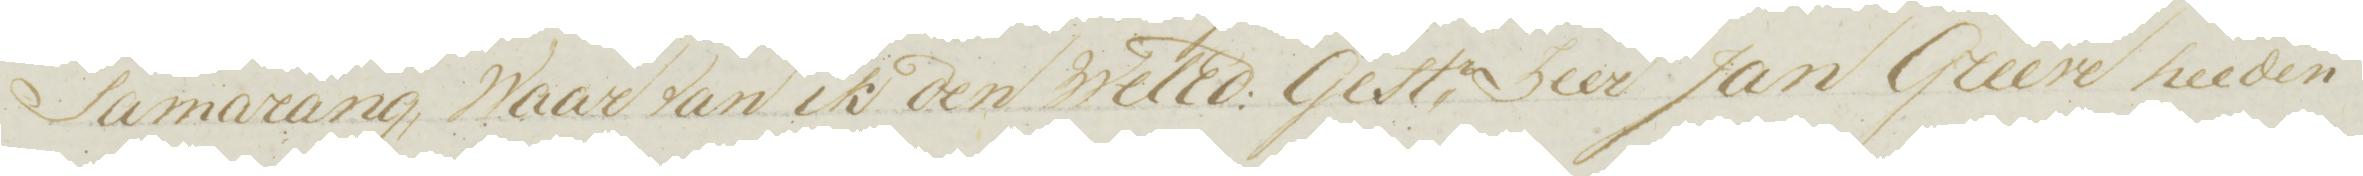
Samarang, Waar van ik den Wel Ed: Gest„r Heer Jan Greeve heeden
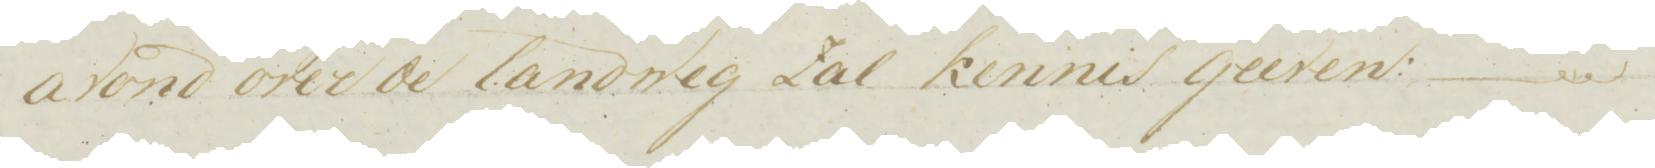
avond over de landweg Zal kennis geeven: —
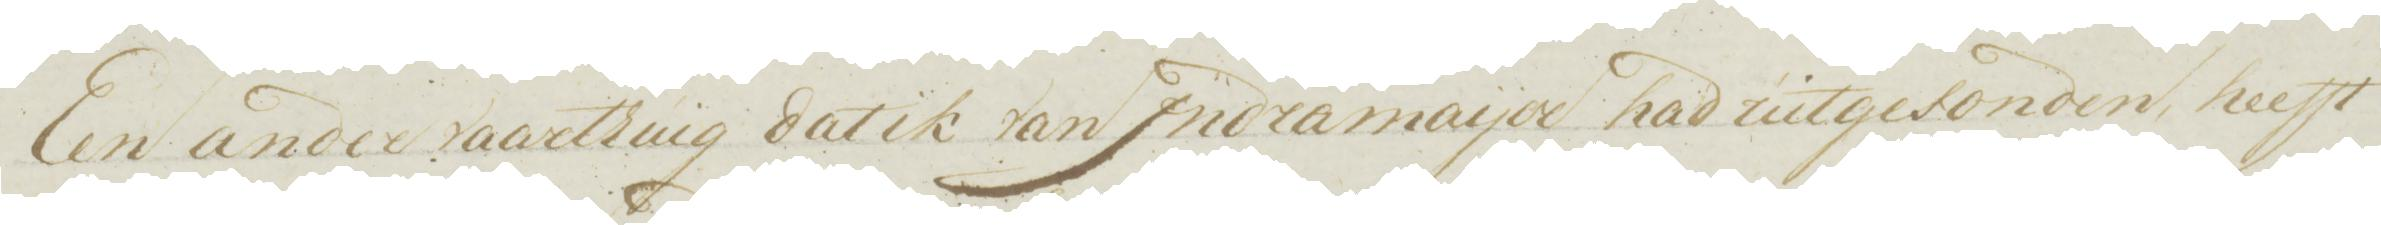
Een ander vaarthuig dat ik van Jndramaijoe had uitgesonden, heeft
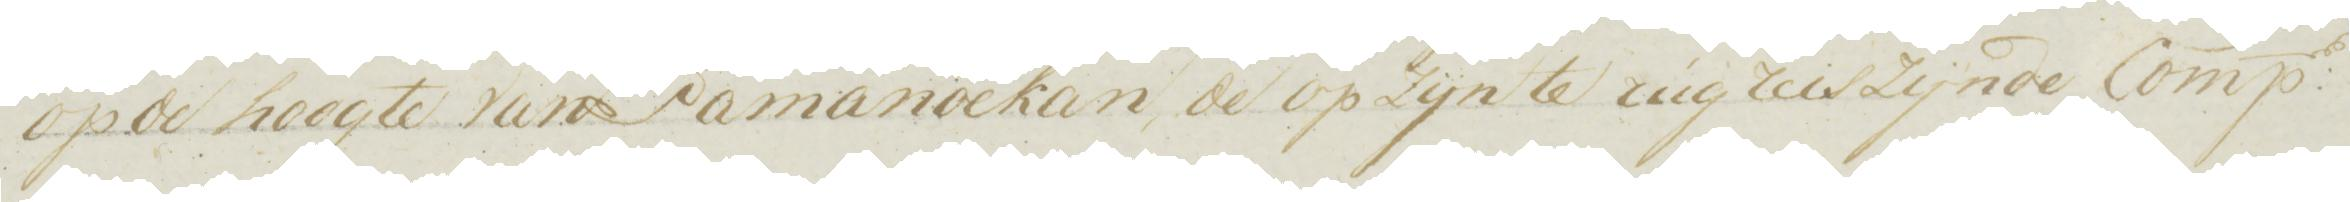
op de hoogte van Pamanoekan, de op zijn te rug reis Zijnde Comp:s
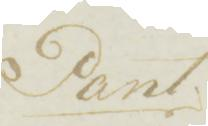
Pant
